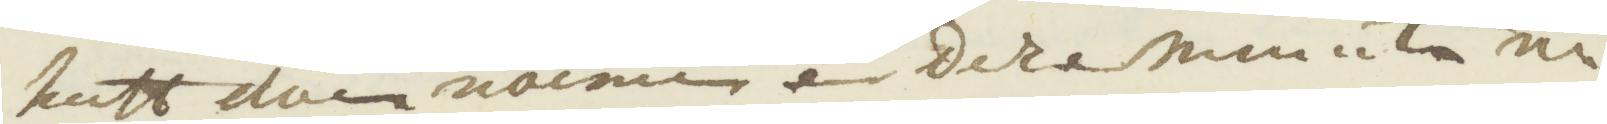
heeft doen noemen en deze minute na
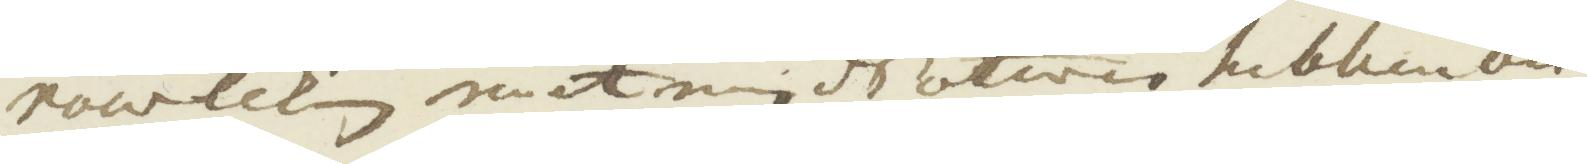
voorlezing met mij Notaris hebben on
